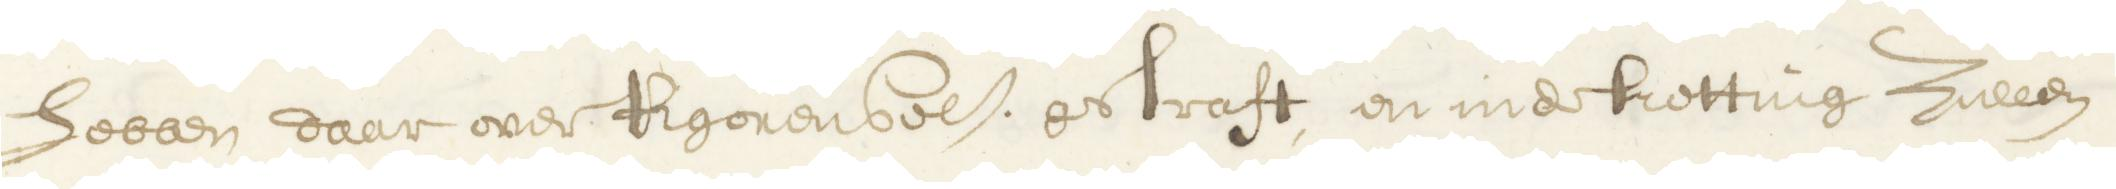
hebben daar over Vigoreuselijk gestraft, en in de ketting zullen
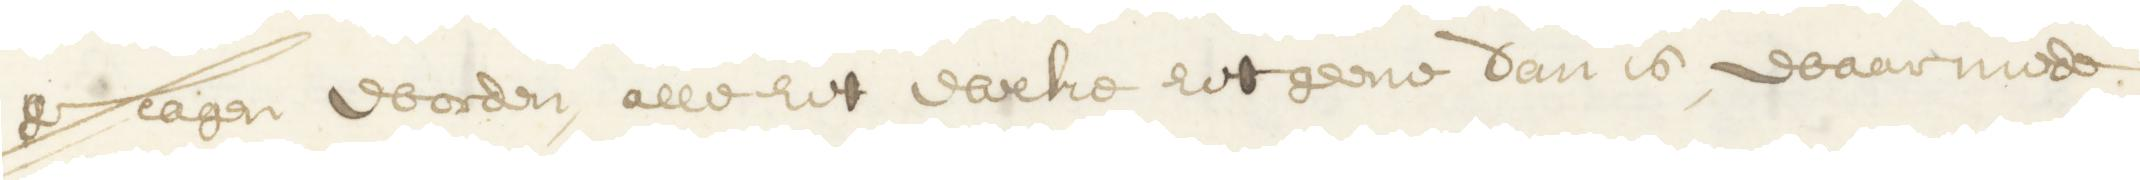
geslagen worden, alle het welke het geene dan is, waarmede
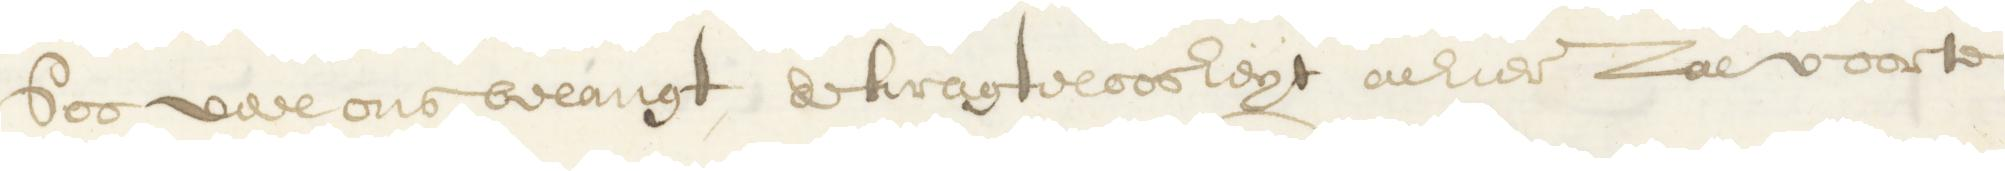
soo veel ons belangt dekragteloosheijt alhier zal voorte
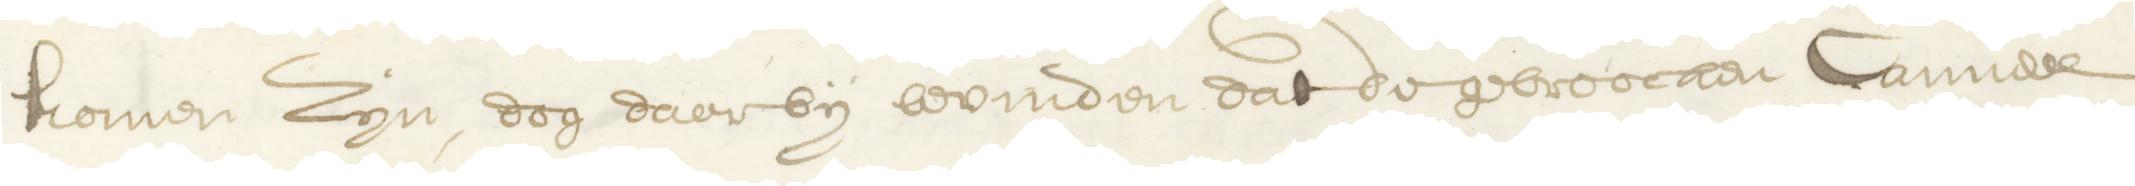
komen zijn, dog daar bij bevinden dat de gebroocken Canneel
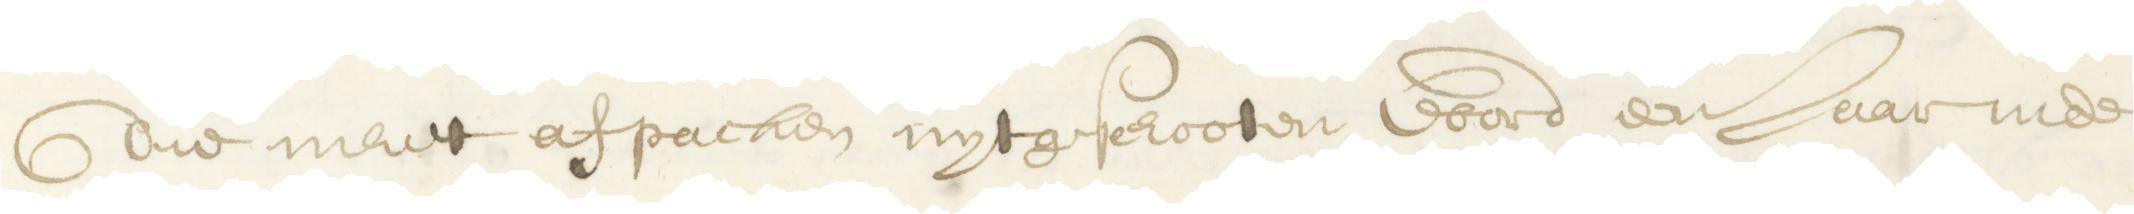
die inhet afpacken uijtgeschooten werd een Jaar inde
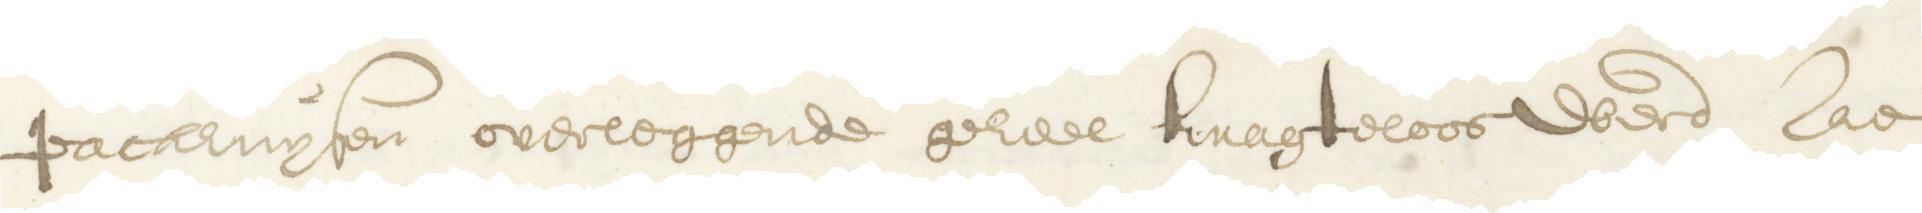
packhuijsen overleggende geheel kragteloos werd, zoo
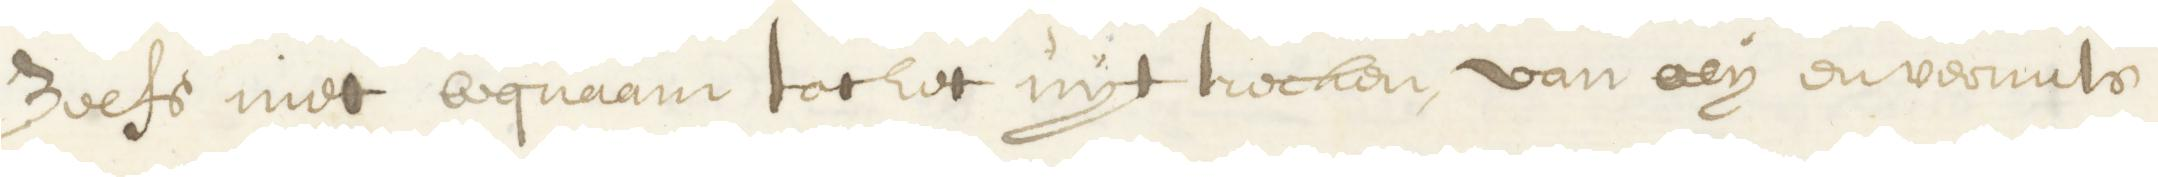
zelfs niet bequaam tot het uijt trecken, van olij envermits
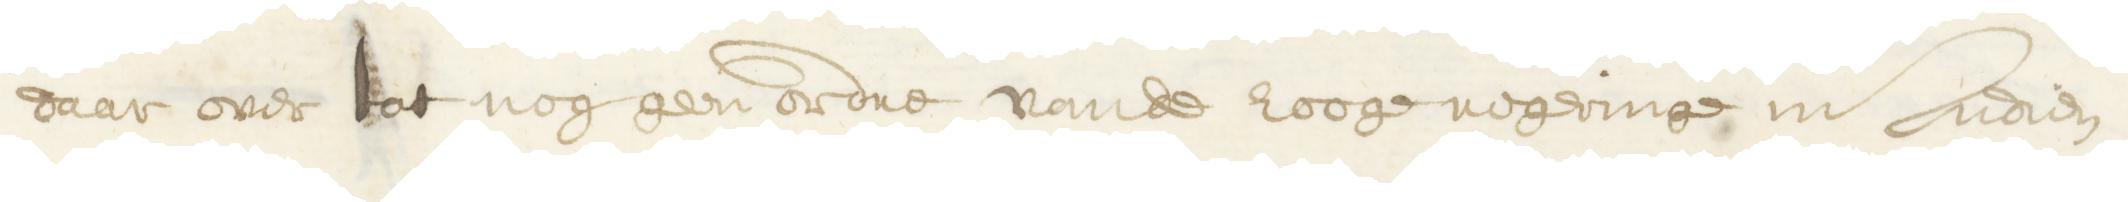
daar over tot nog geen ordre vande hooge regeringe in Jndien
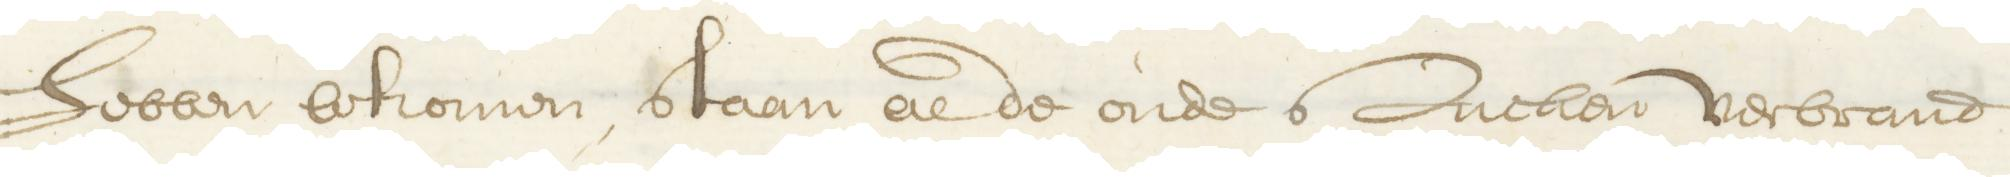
hebben bekomen, staan al de oude stucken verbrand
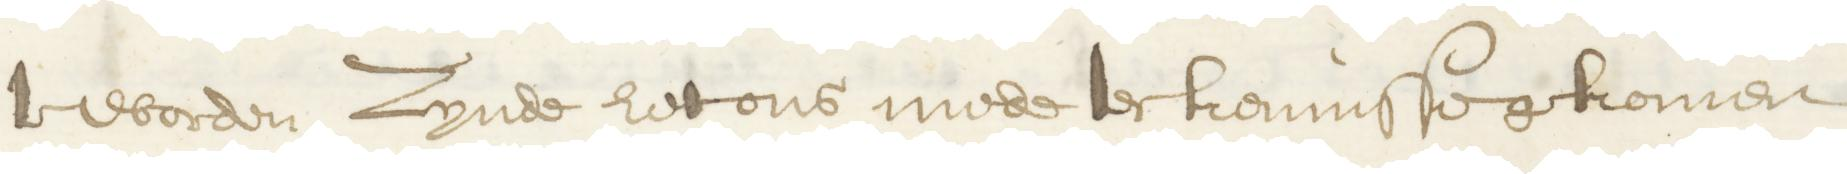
teworden zijnde het ons mede ter kennisse gekomen
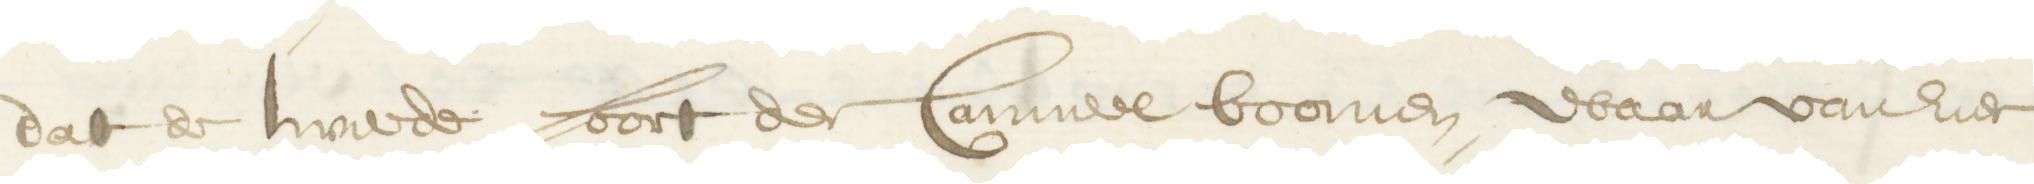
dat de tweede soort des Canneel boomen waar van hier
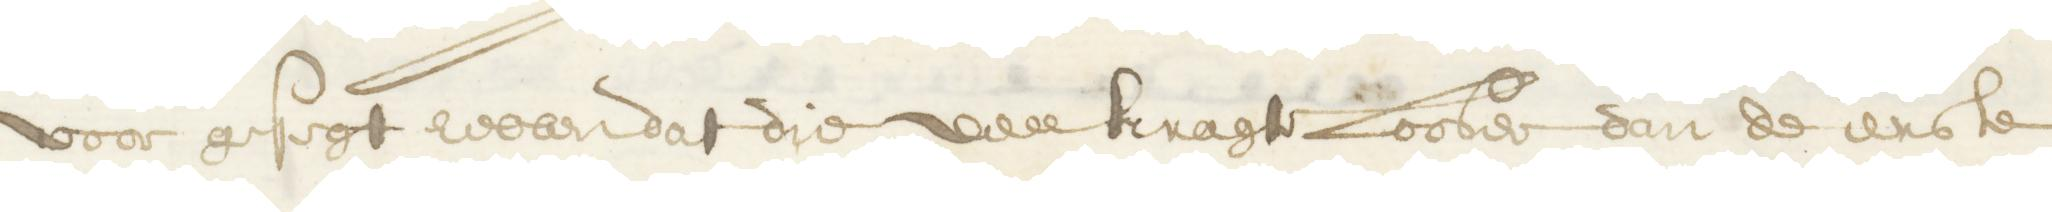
voor gesegt hebben dat die veel kragtelooser dan de eerste
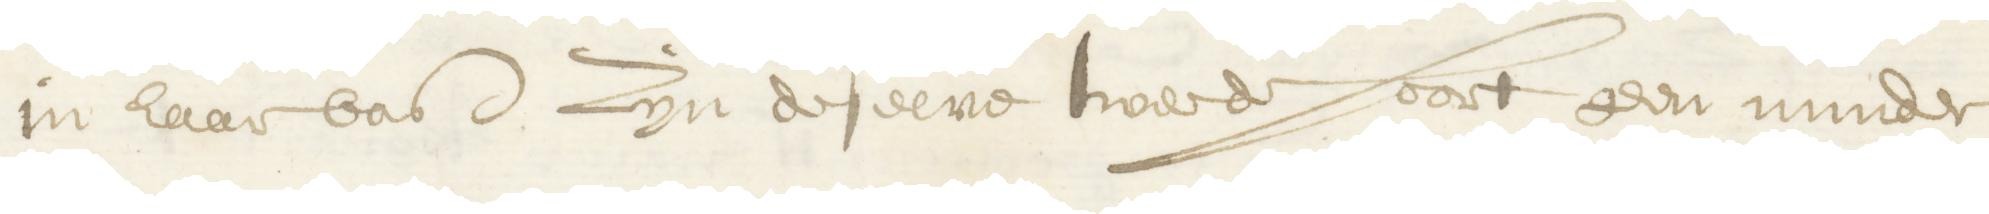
in haar bast zijn deselve tweede soort geen minder
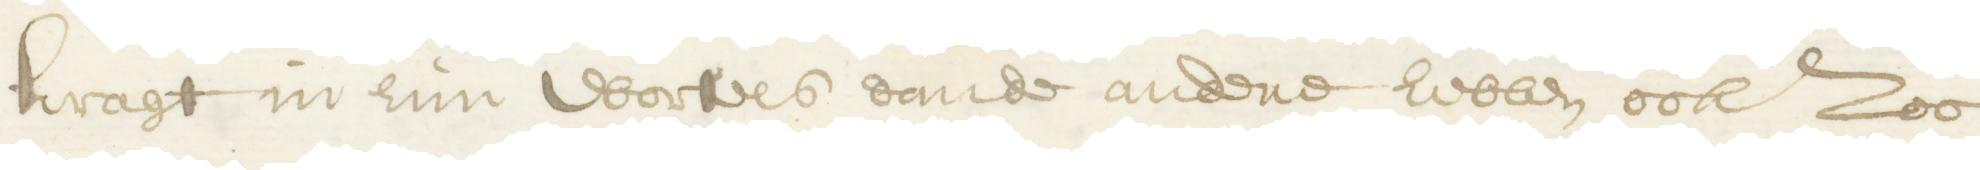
kragt in hun wortels dande andere hebben ook zoo
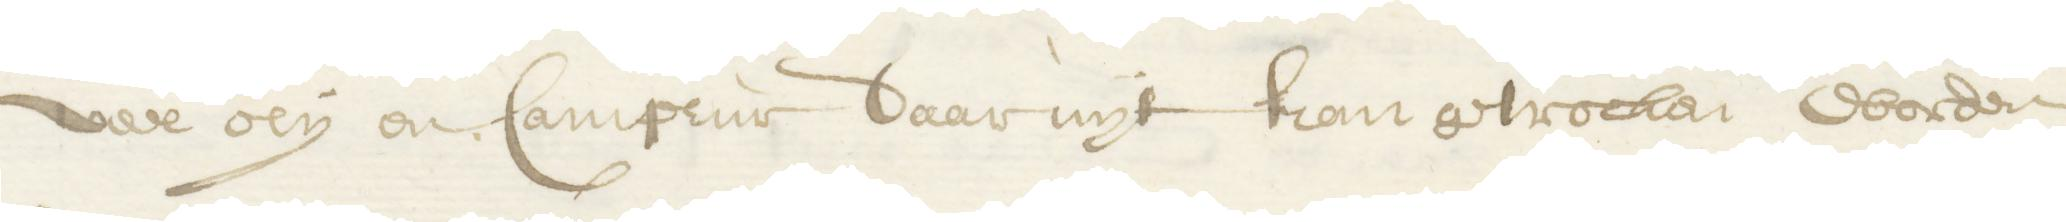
veel olij en Camphur daar uijt kan getrocken worden
